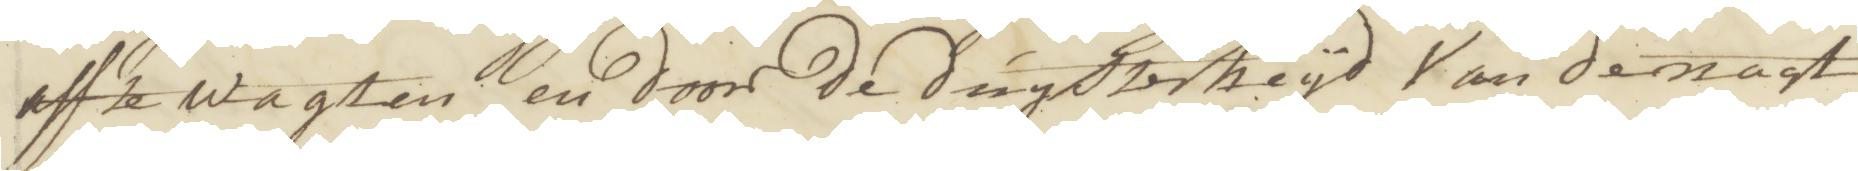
aff te wagten en doors de duysterheijd van de nagt
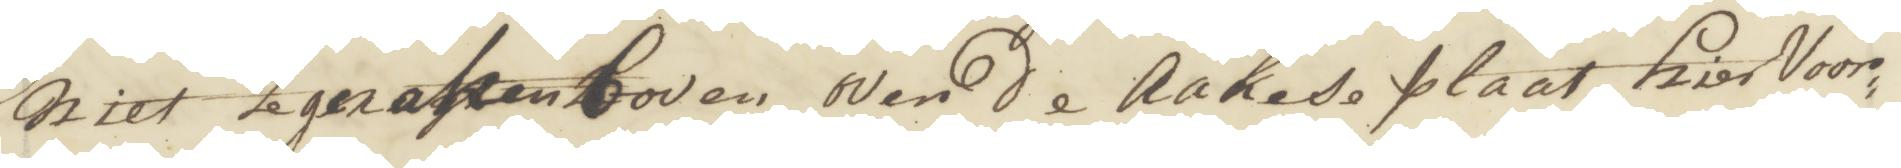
niet te gerasten boven over de Aakese plaat, hier Voor„
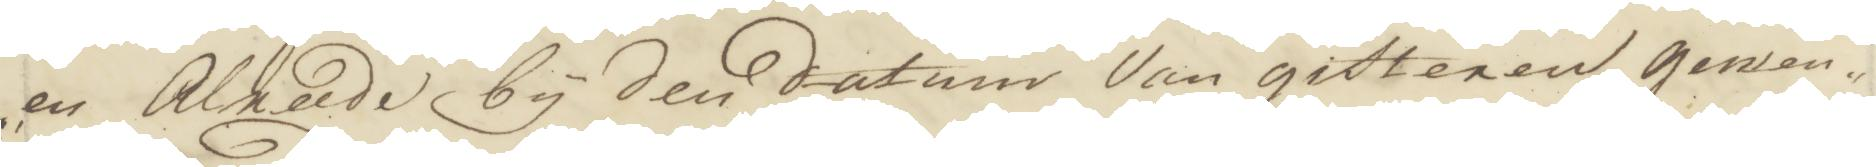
„en Alreede bij den datum Van gisteren gemen„
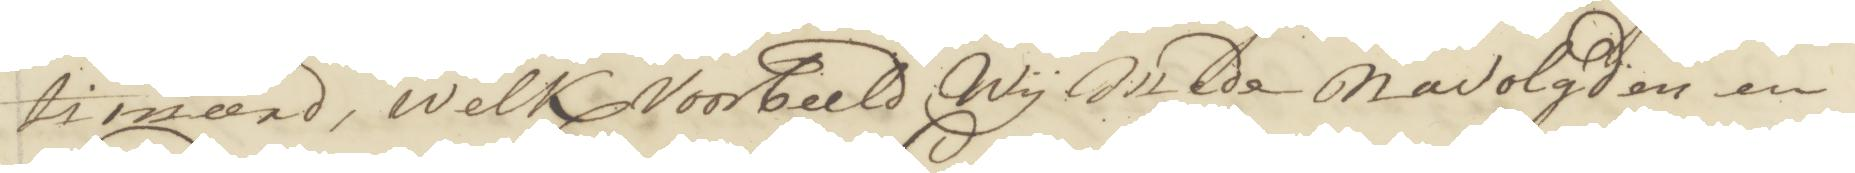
tioneerd, welk voorbeeld Wij Mede navolgden en
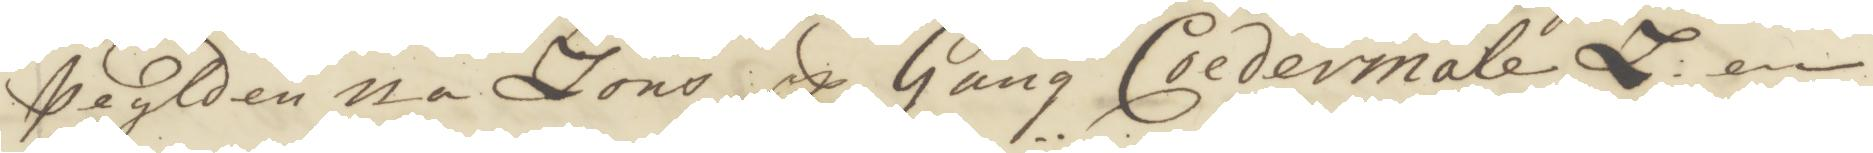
peylden na Zons op Gang Coedermale Z: en
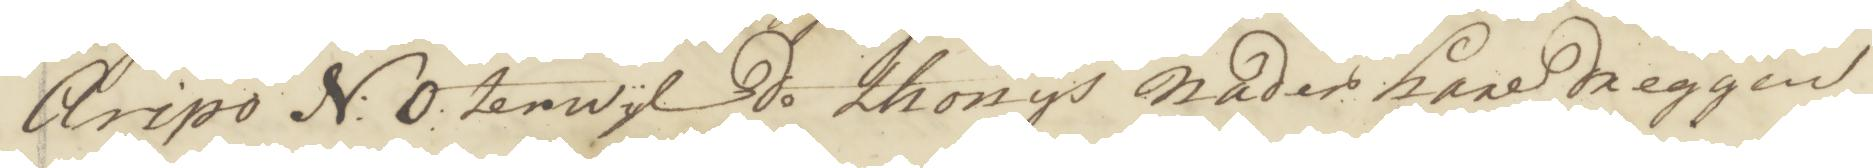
Aripo N: O: terwijl do thonijs nader hare dreggen
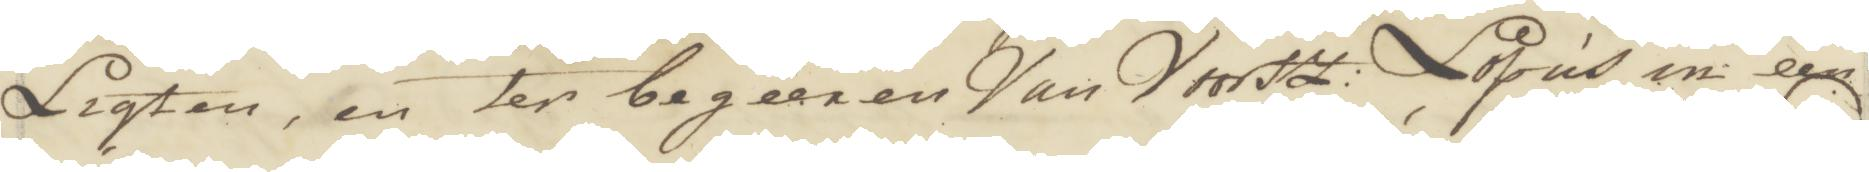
Ligten, en ter begeeren Van Voorsz: Lopus in een
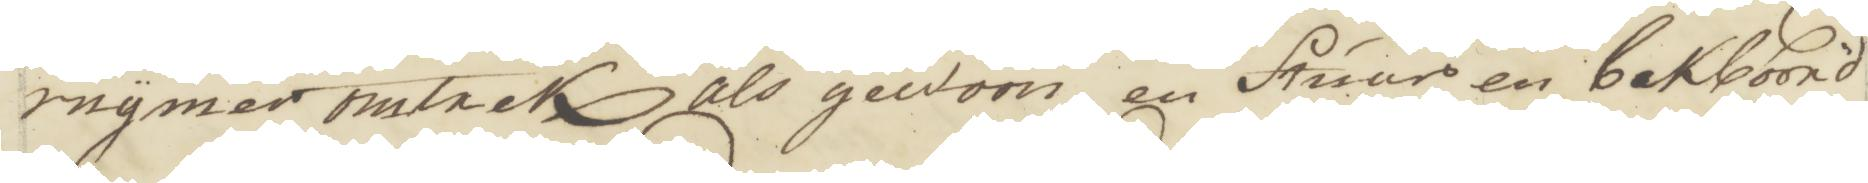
ruijmer omtrek als gewoon, en stuur en bakboord
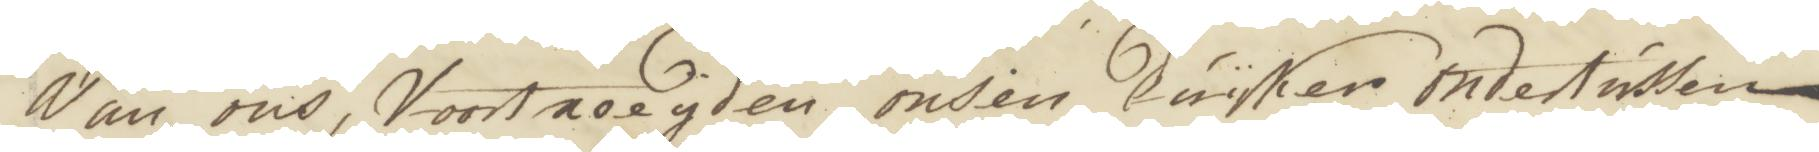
Van ons, voortroeijden onsen duijker ondertussen
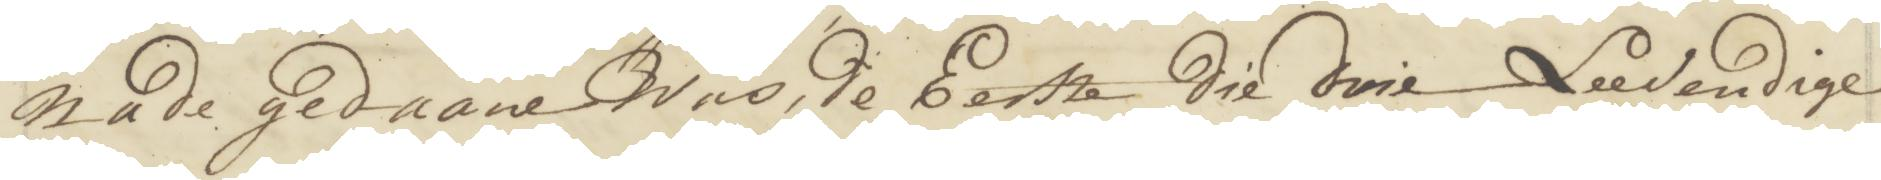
nade gedaane Was, de Eerste die drie Leevendige
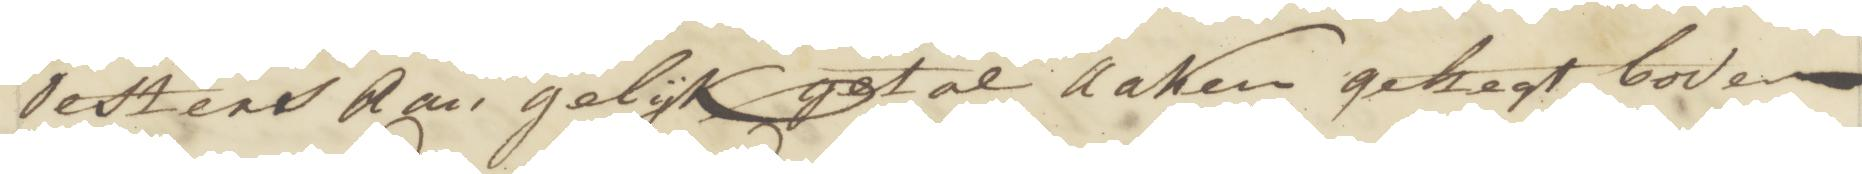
Oesters Aan gelijk getal Aaken gekogt boven
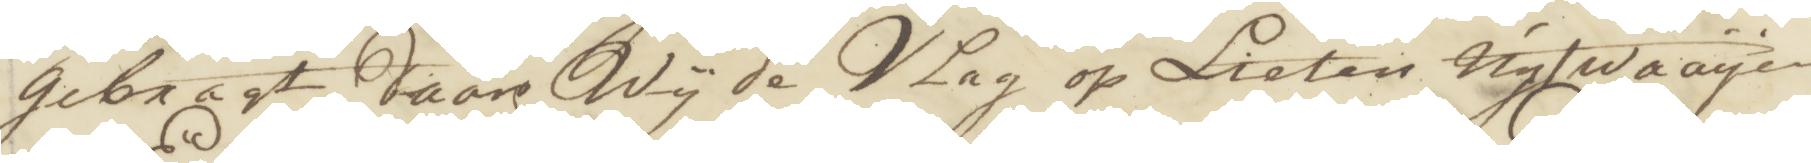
gebragt, daar Wij de Vlag op Lieten Uijtwaaijen
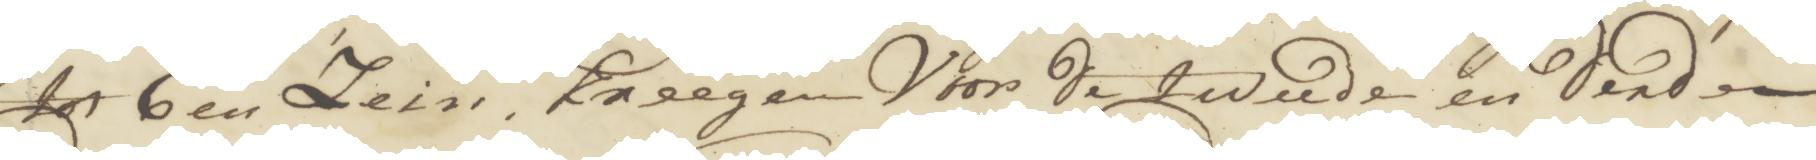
tot Een zein, kreegen Voor de tweede en derden
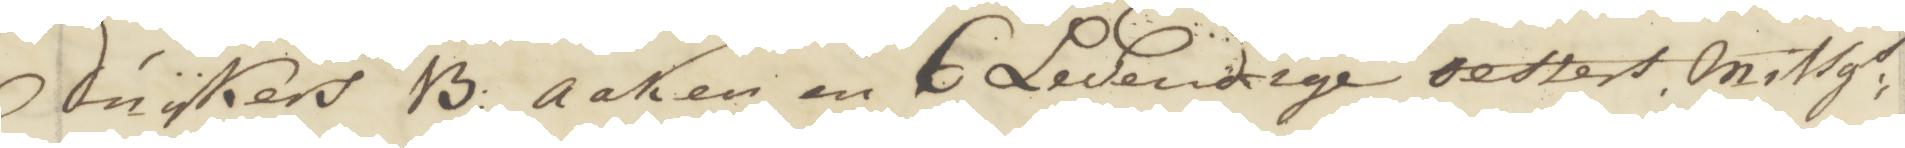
duijkers 13: Aaken en 6 Levendige oesters, mitsg:s
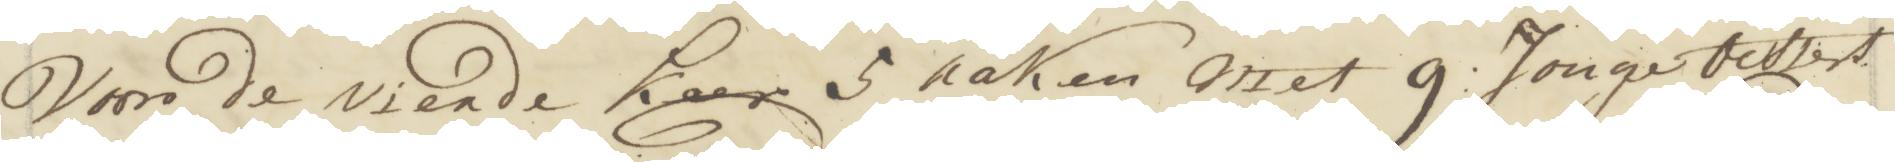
Voor de vierde keer 5 Aaken met 9: Jonge oesters
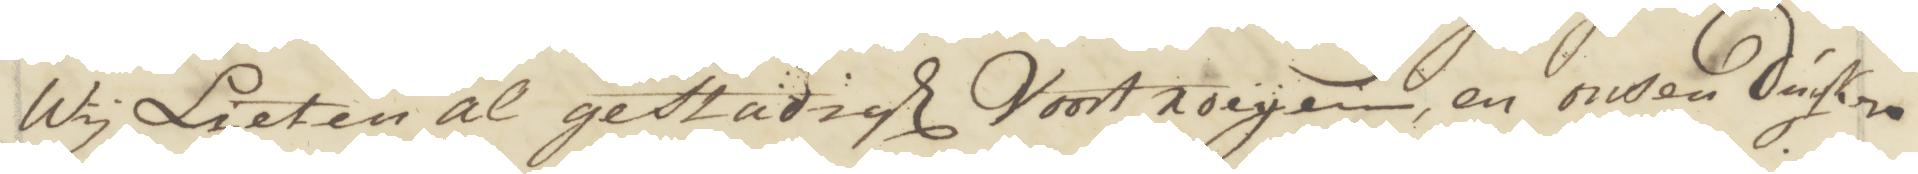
wij Lieten al gestadigh Voortroeijen, en onsen duijker
